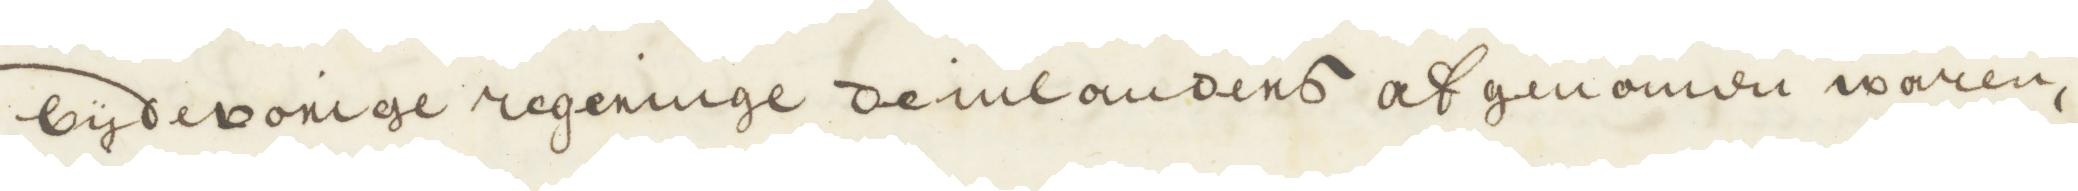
bij de vorige regeringe de inlanders afgenomen waren,
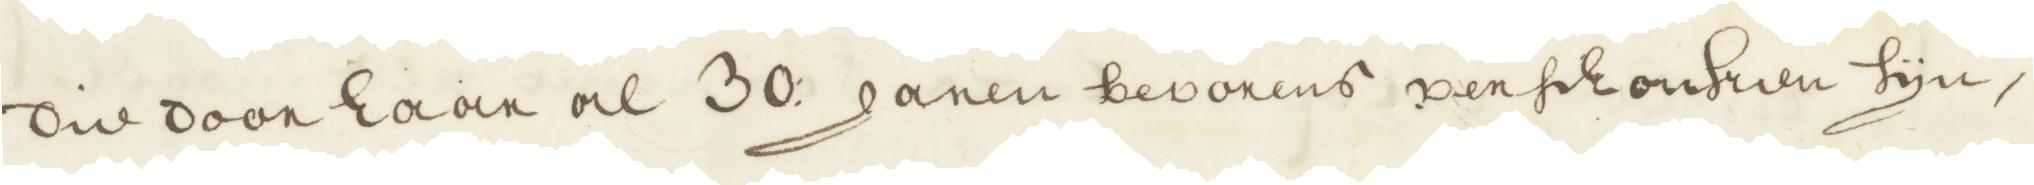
die door haar al 30: Jaren bevorens verschonken sijn,
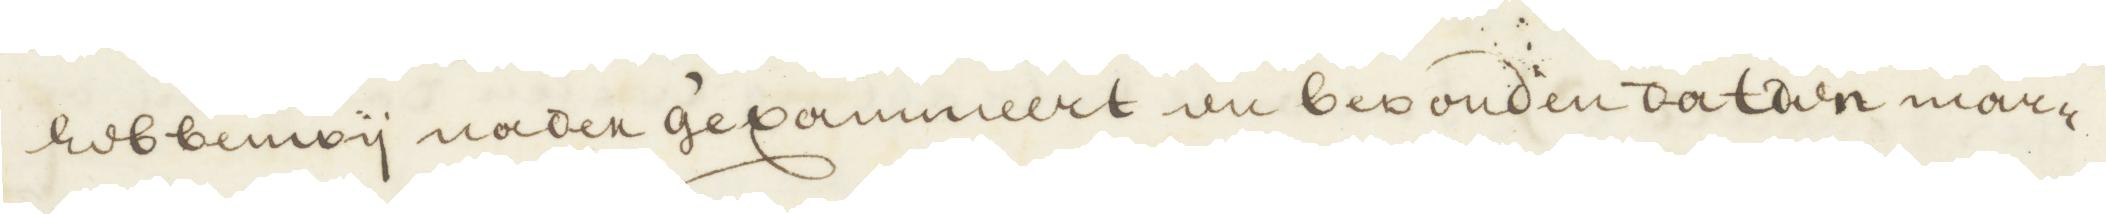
hebben wij nader g'examineert en bevonden dat den mar„
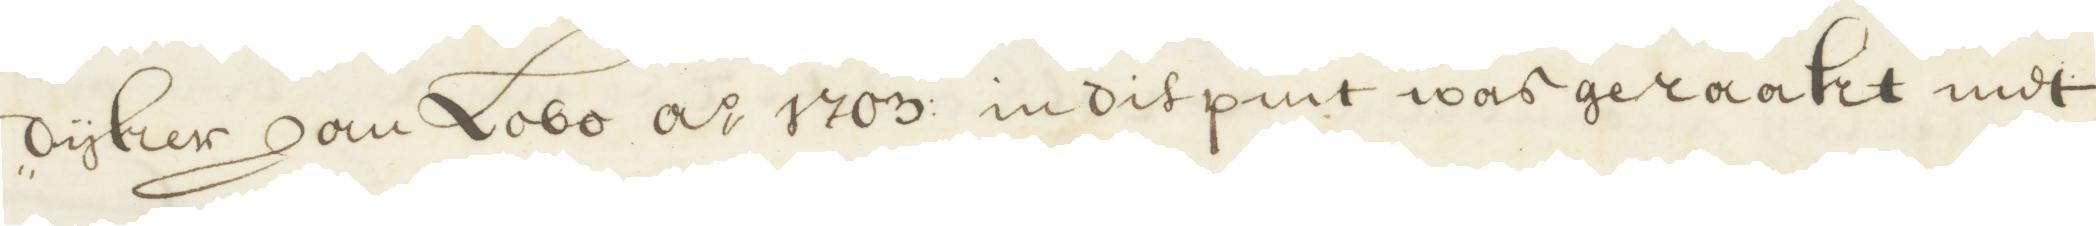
„dijker Jan Lobo a„o 1703: in dispuit was geraakt met
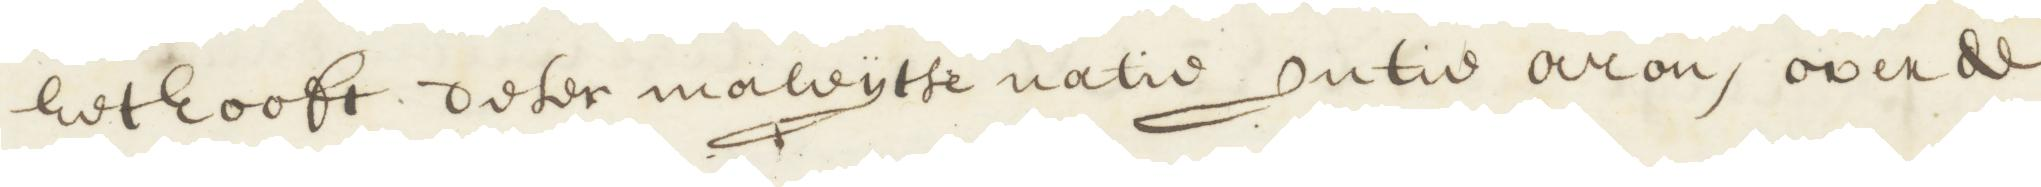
het hooft deser maleijtse natie Jntie aron, over de
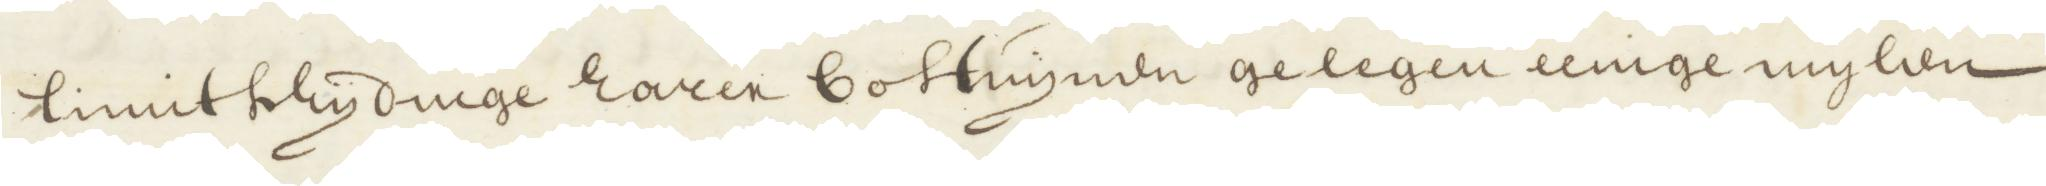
linuitschijdinge harer bostuijnen gelegen eenige mijlen
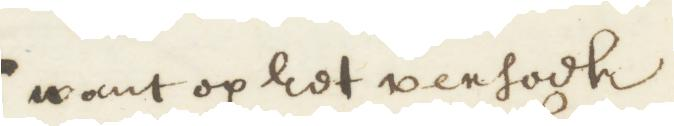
want op het versoek
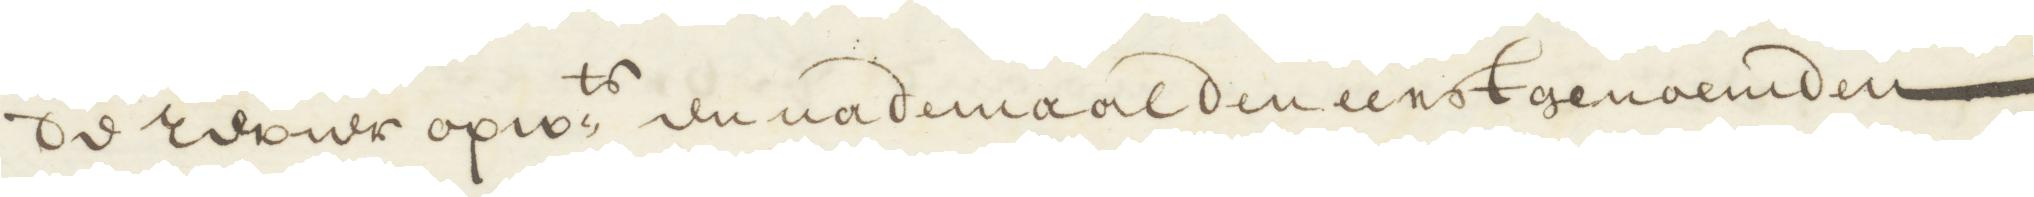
de revier opw„ts en nademaal den eerst genoemden
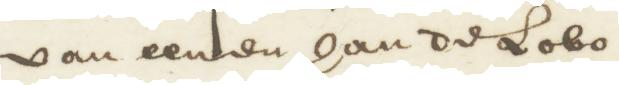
van eenen Jan de Lobo
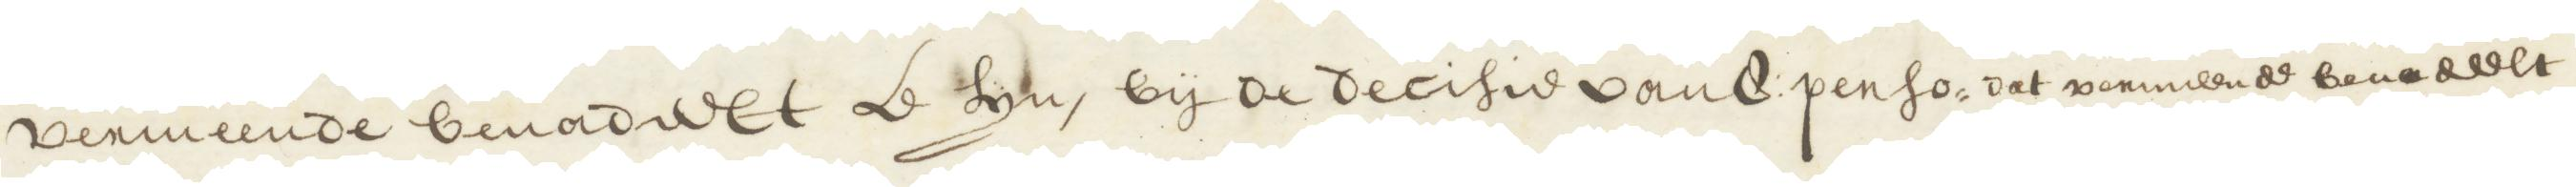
vermeende benadeelt te sijn, bij de decisie van 8: perso„ dat vermeende benadeelt
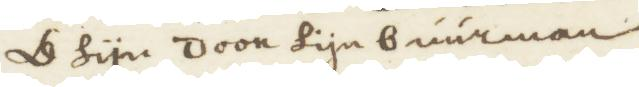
te sijn door sijn buurman
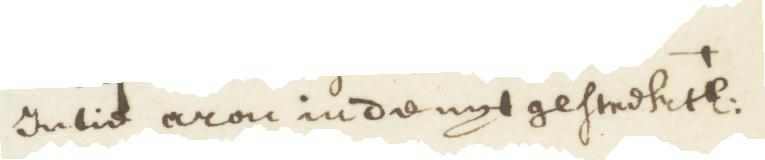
Jntie aron in de uyt gestrekth:t
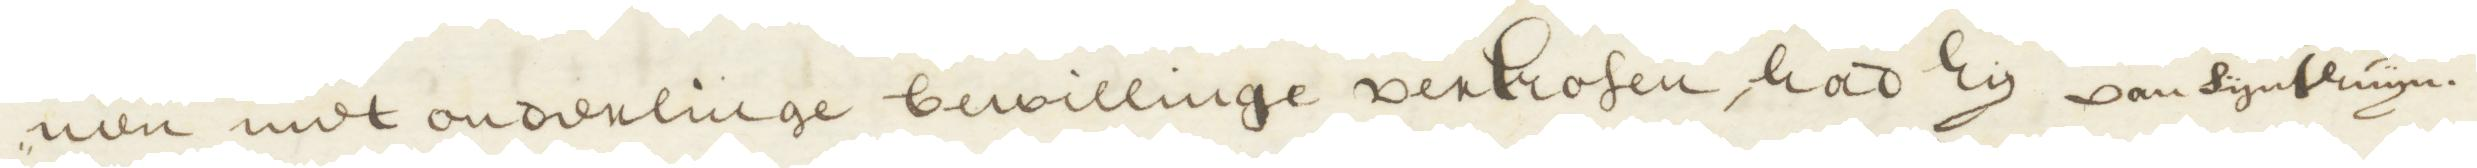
„nen met onderlinge bewillinge verkosen, had hij van sijn thuijn.
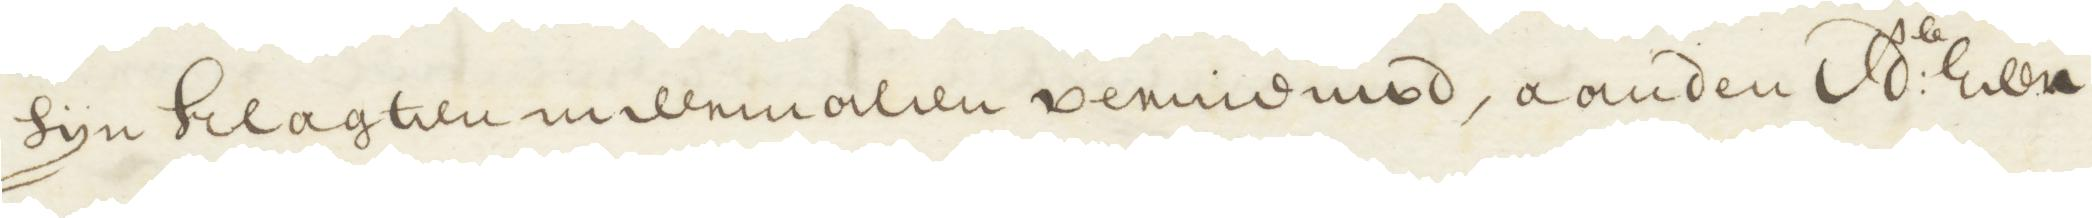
sijn klagten meermalen vernieuwd, aan den Ed:le heer
